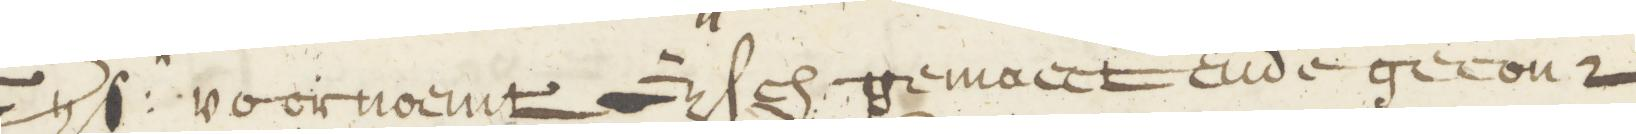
Eys:r voornoemt Eijsch gemaect ende gecon
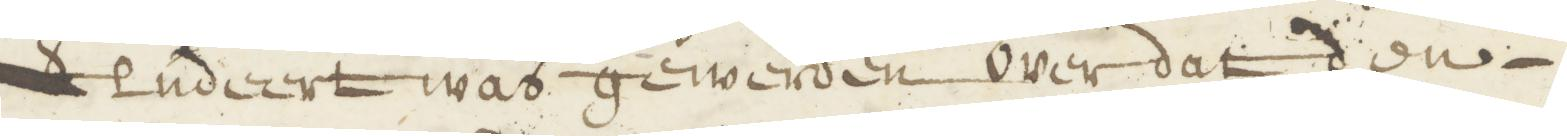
cludeert was gewerden over dat den
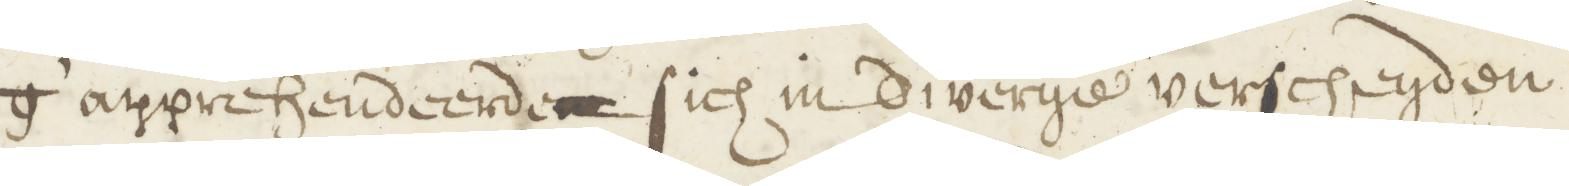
g’apprehendeerde sich in diverije verscheyden
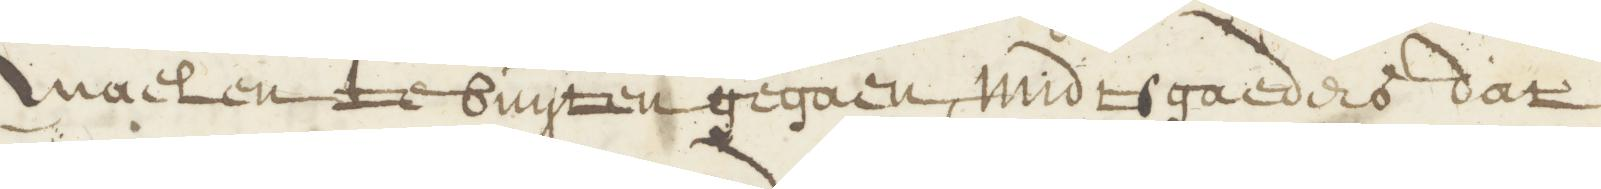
Maelen te buijten gegaen, midtsgaeders dat
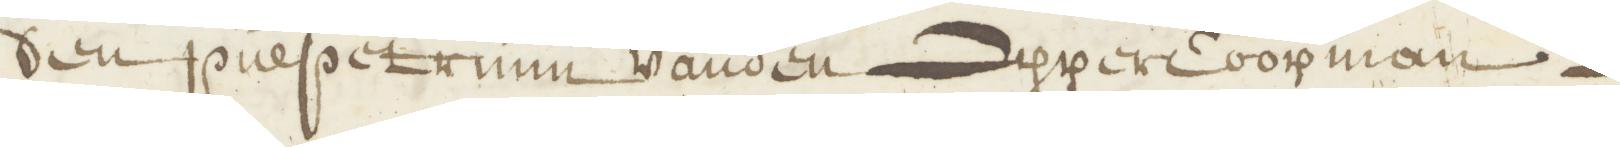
den pulpetrium vanden Oppercoopman —
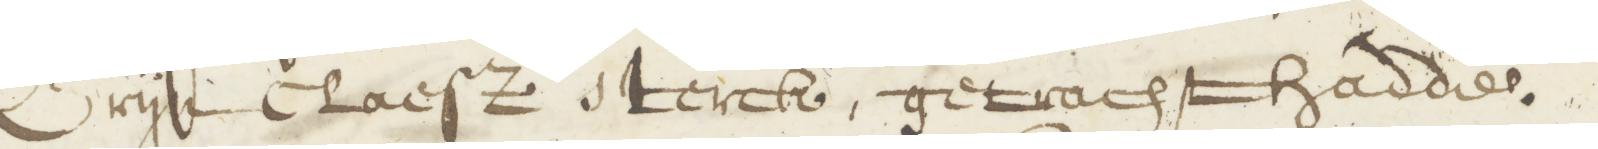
Crijn claesz sterck, getracht hadde.
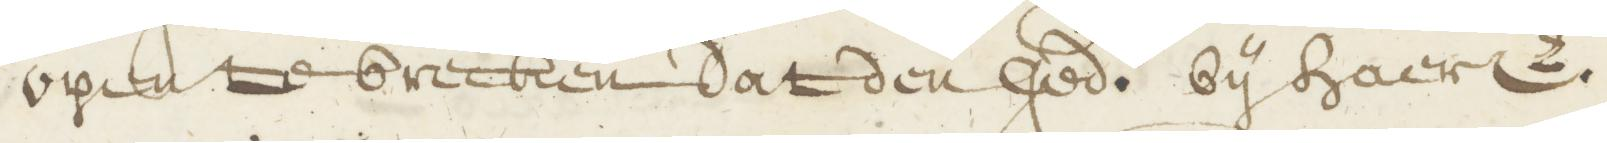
open te brecken dat den ged.e bij haer E.
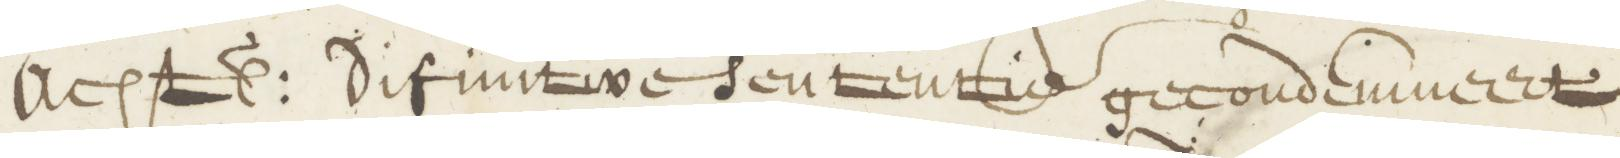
Achtb: difinitive sententie gecondemneert
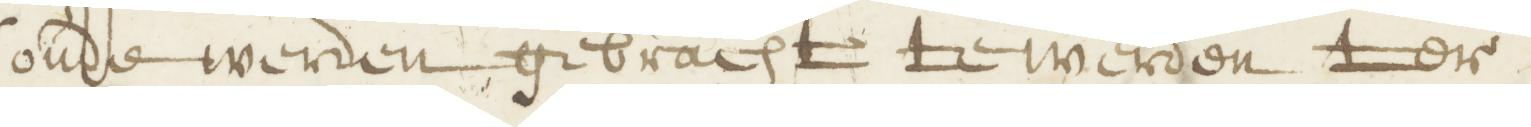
soude werden gebracht te werden ter
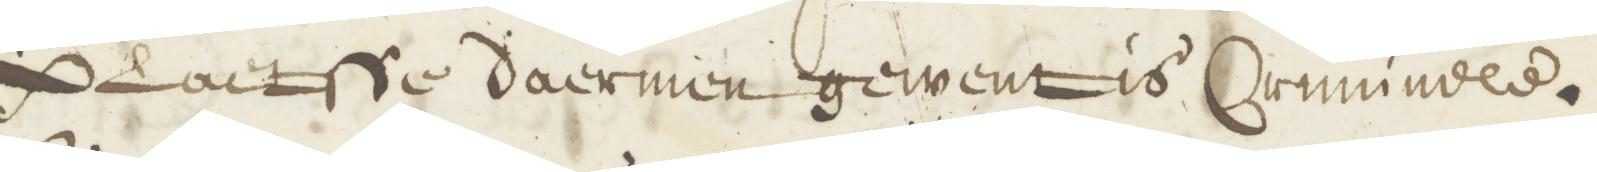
plaetsse daermen gewent is Criminele.
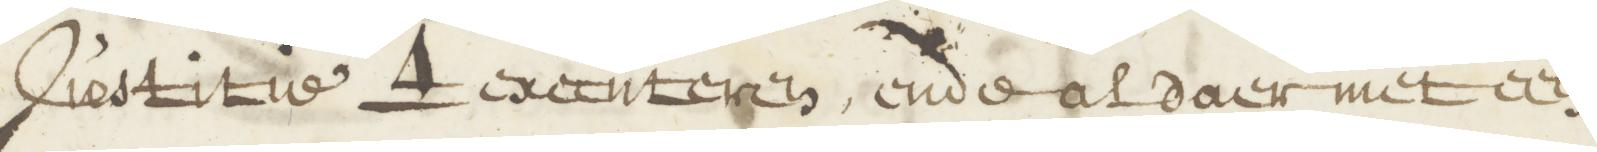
Justitie t executeren, ende aldaer met een
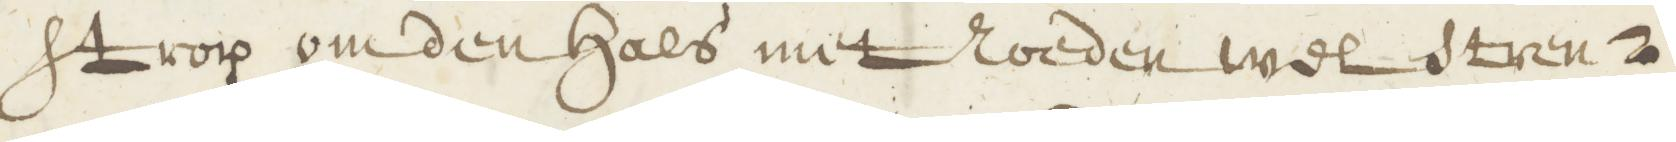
strop om den hals met roeden wel stren
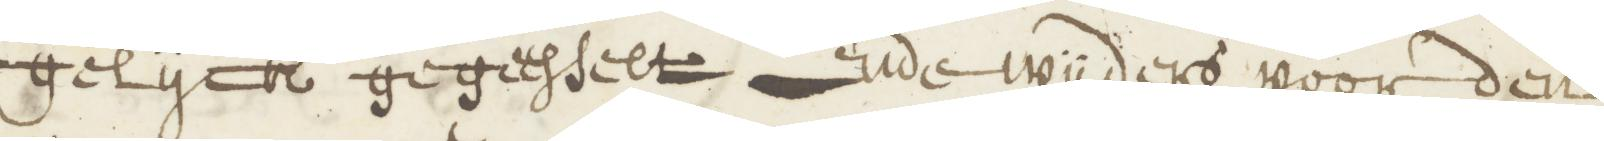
gelijck gegeesselt ende wijders voor den
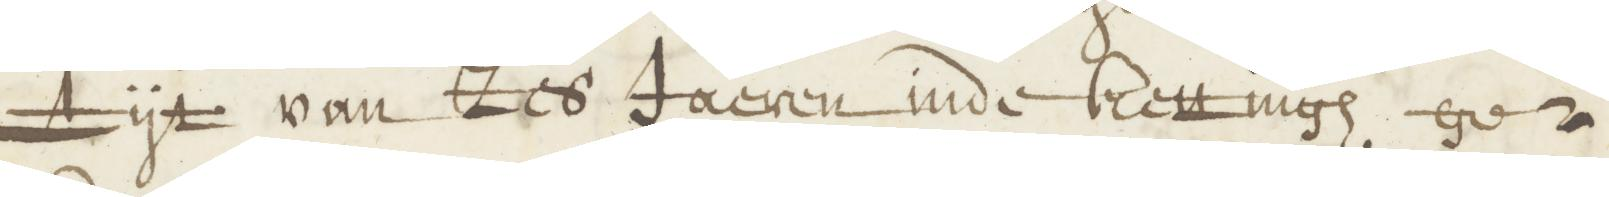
tijt van Zes Iaeren inde kettingh ge„
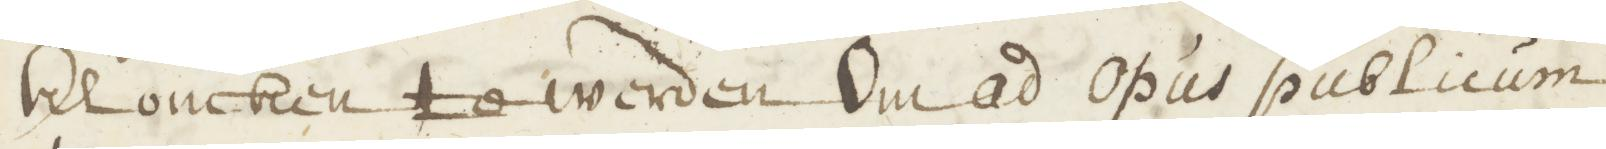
kloncken tewerden Om ad opus publicum
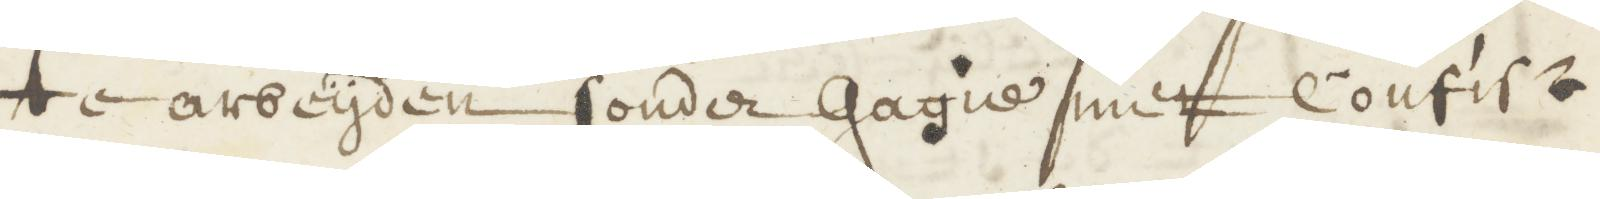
te arbeijden sonder Gagie met Confis
